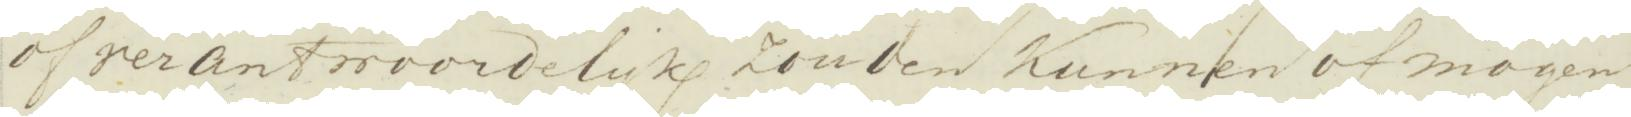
of verantwoordelijk zouden kunnen of mogen
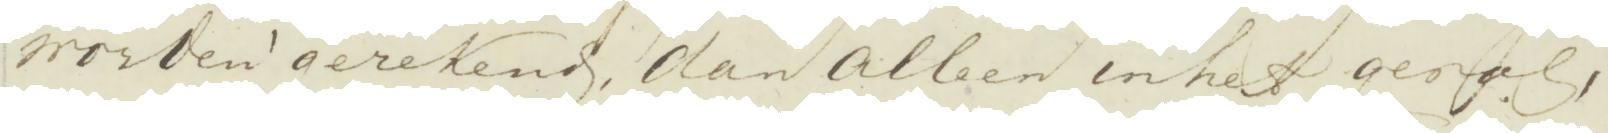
worden gerekend, dan alleen in het geval,
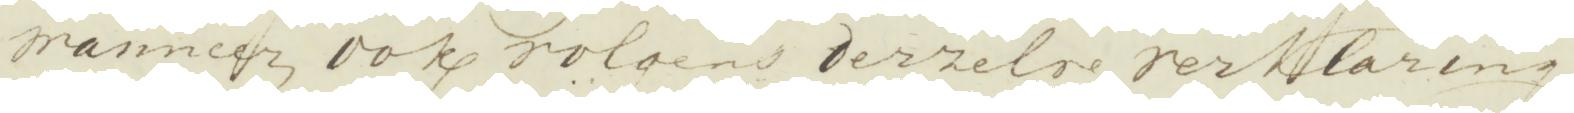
wanneer ook volgens derzelve verklaring
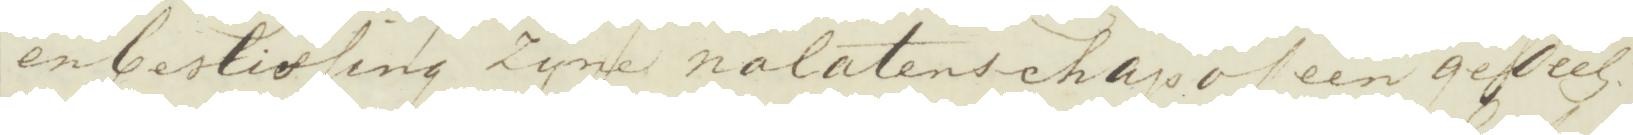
en beslissing zyne nalatenschap of een gedeel„
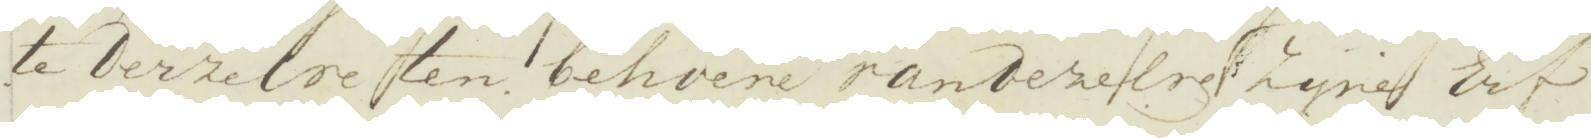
te derzelve ten behoeve van dezelve zijne Erf
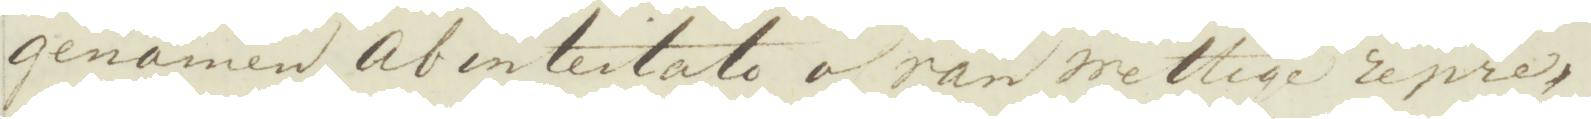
genamen Ab intestato of van wettige repre„
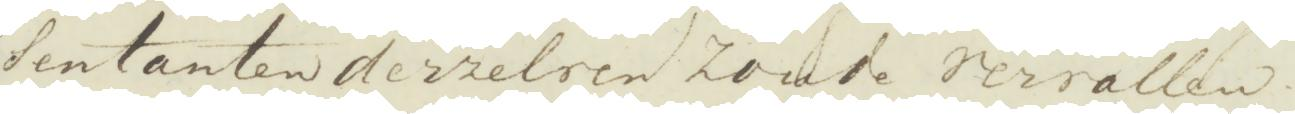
sentanten derzelven zoude vervallen
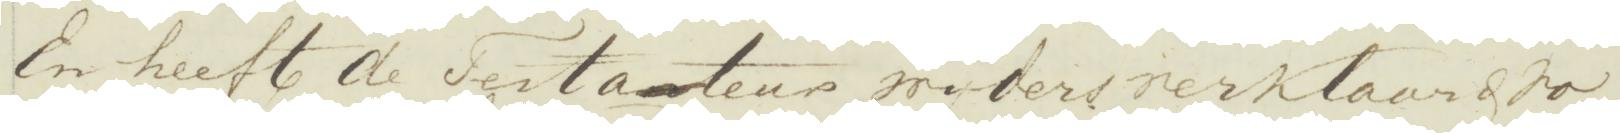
En heeft de Testateur wyders verklaard vo
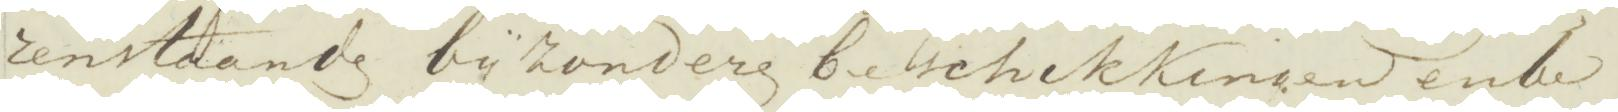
renstaande bijzondere beschikkingen en be
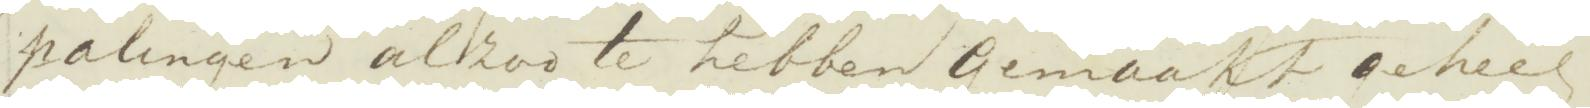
palingen alzoo te hebben gemaakt geheel
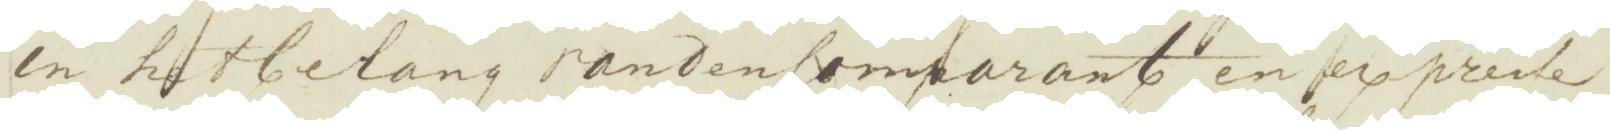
in het belang vanden Comparant en expresse
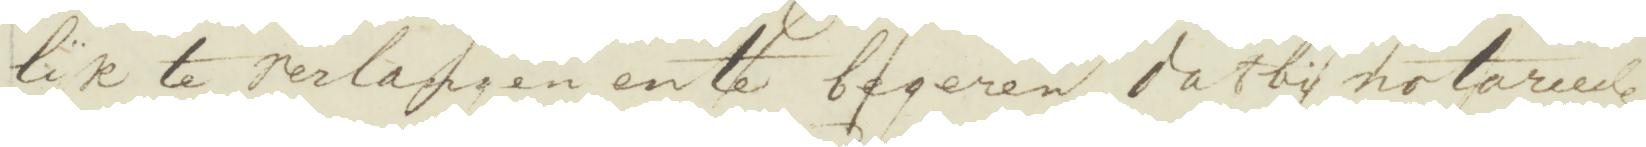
lijk te verlangen en te begeren dat bij notariele
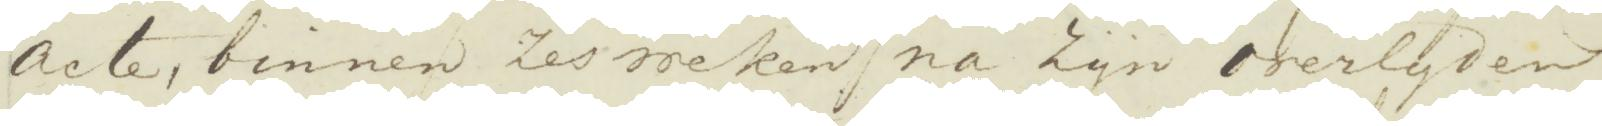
Acte, binnen zes weken na zijn overlyden
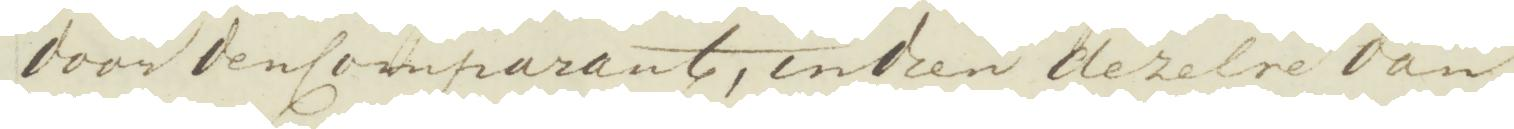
door den Comparant, indien dezelve dan
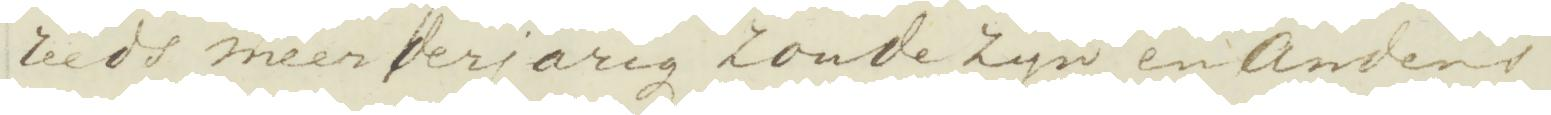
reeds meerderjarig zoude zyn en Anders
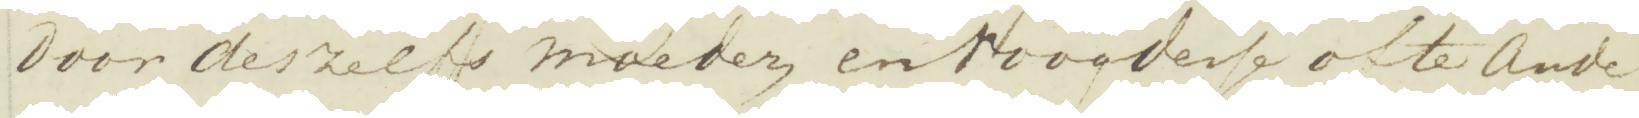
door deszelfs moeder en Voogdesse ofte Ande
